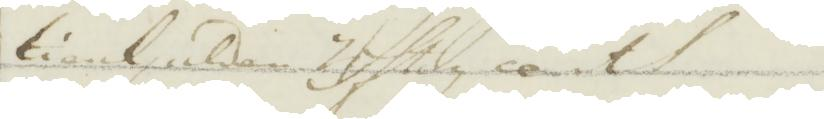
tien Gulden vijftig cents
